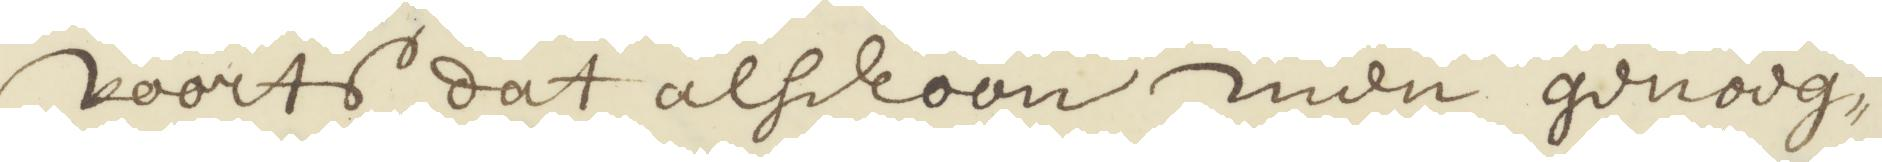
voorts dat alschoon men genoeg„
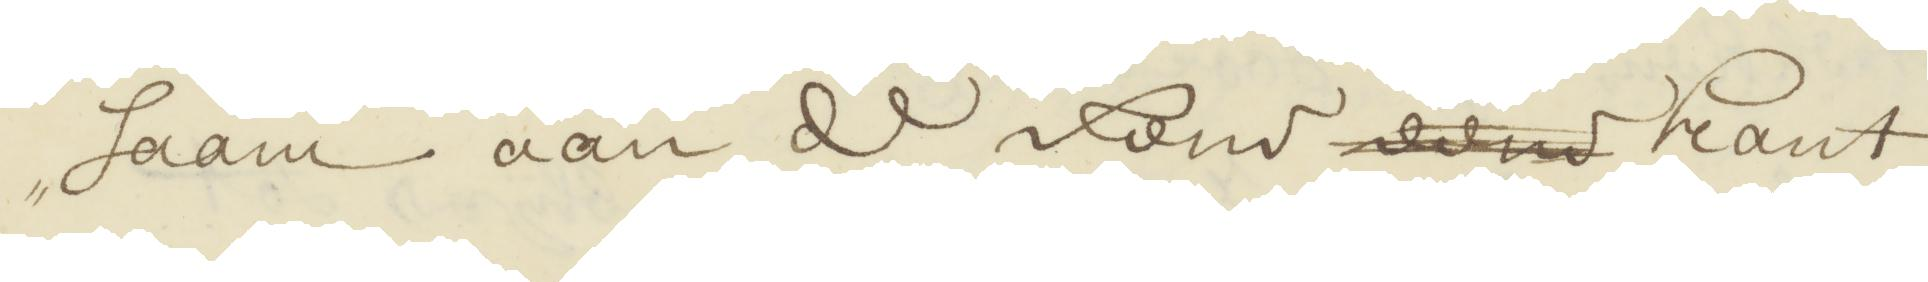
saam aan de Eene eene kant
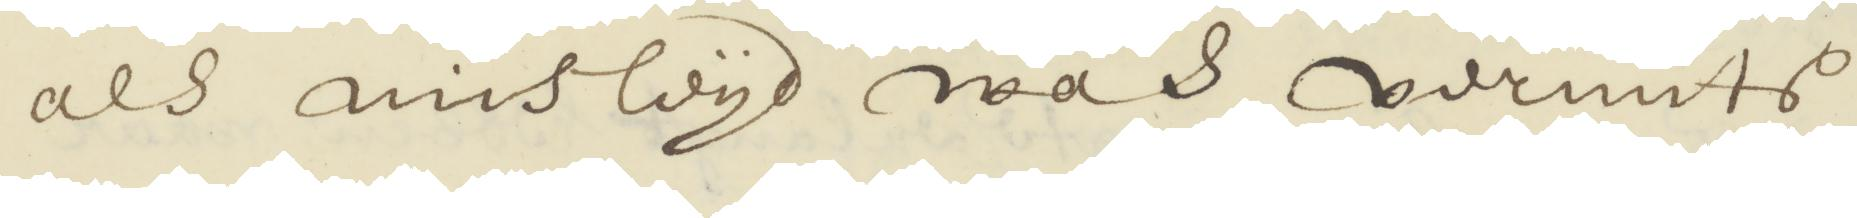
als misleijd was vermits
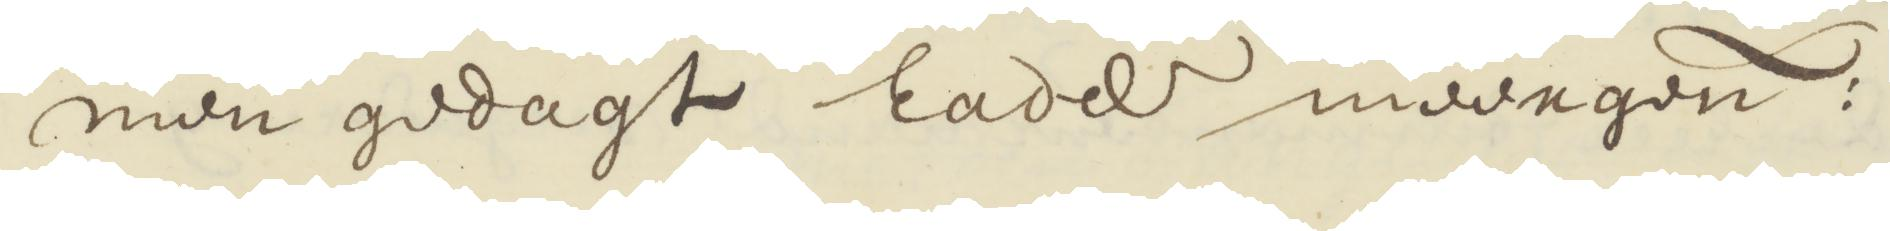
men gedagt hadde meergen:
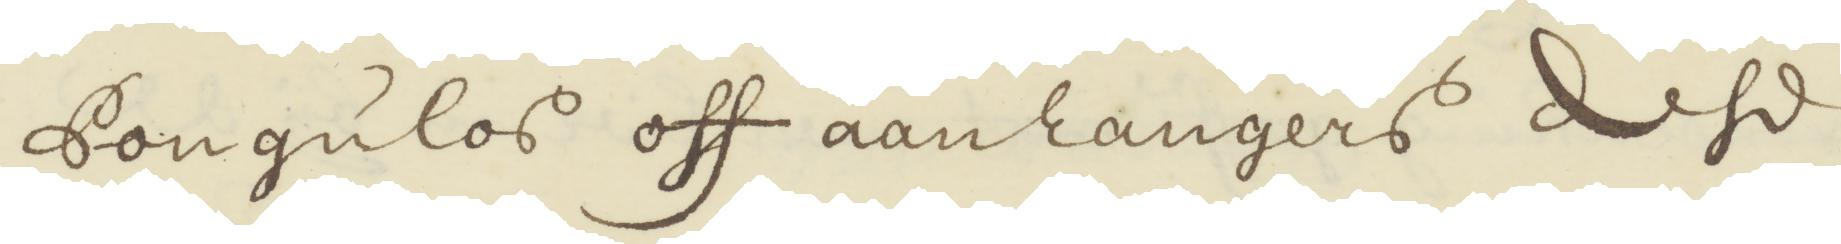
Pongulos off aanhangers dese
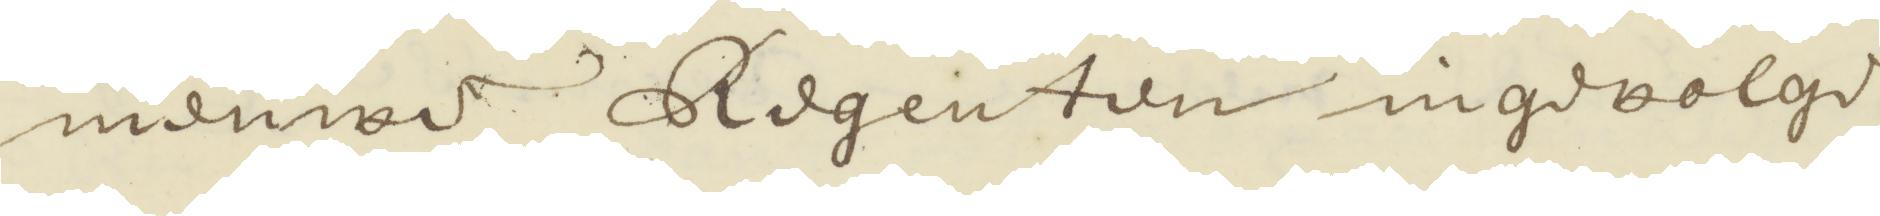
nieuwe Regenten ingevolge
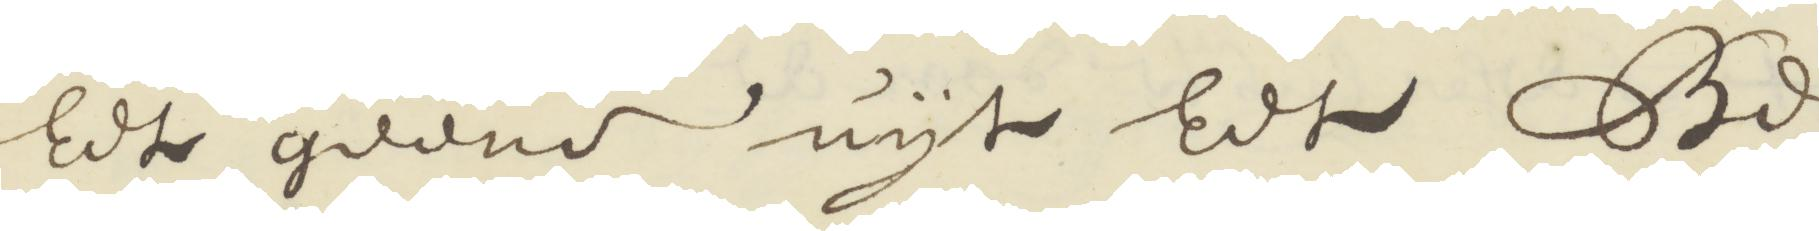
het geene uijt het Be
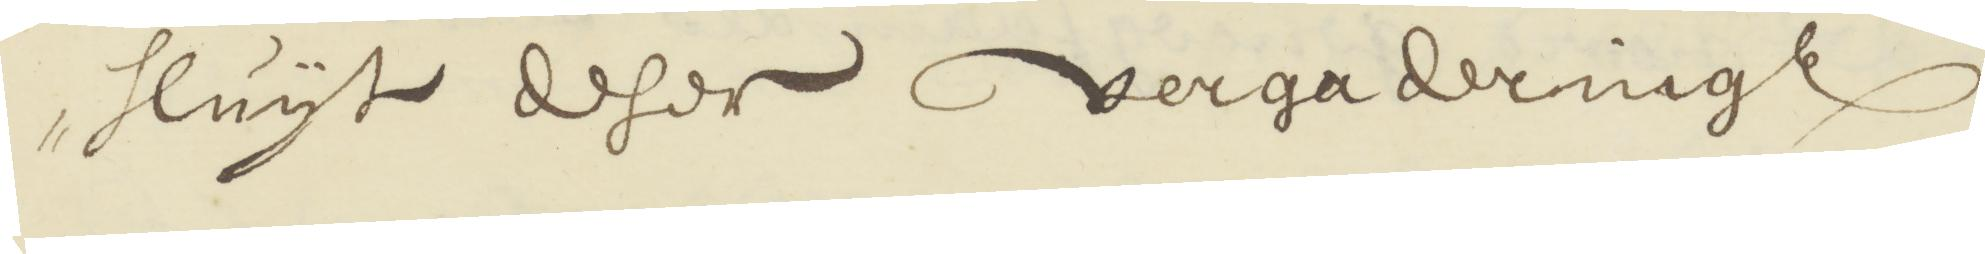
„ sluijt deser vergaderingh
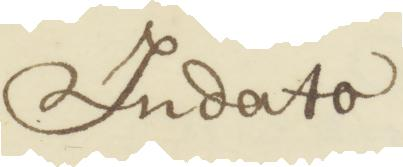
In dato
